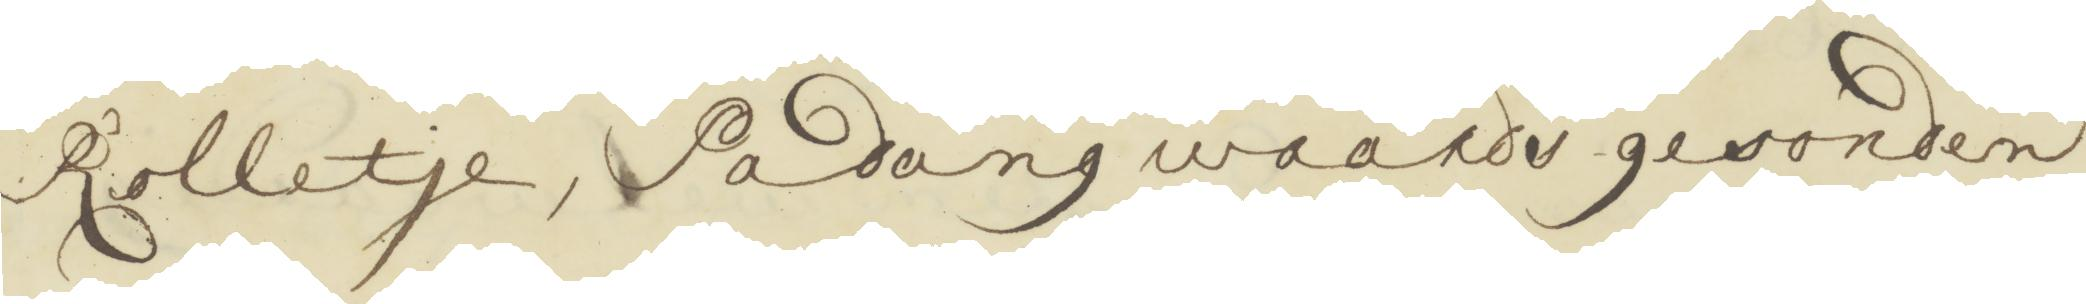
Rolletje, Padang waards gesonden
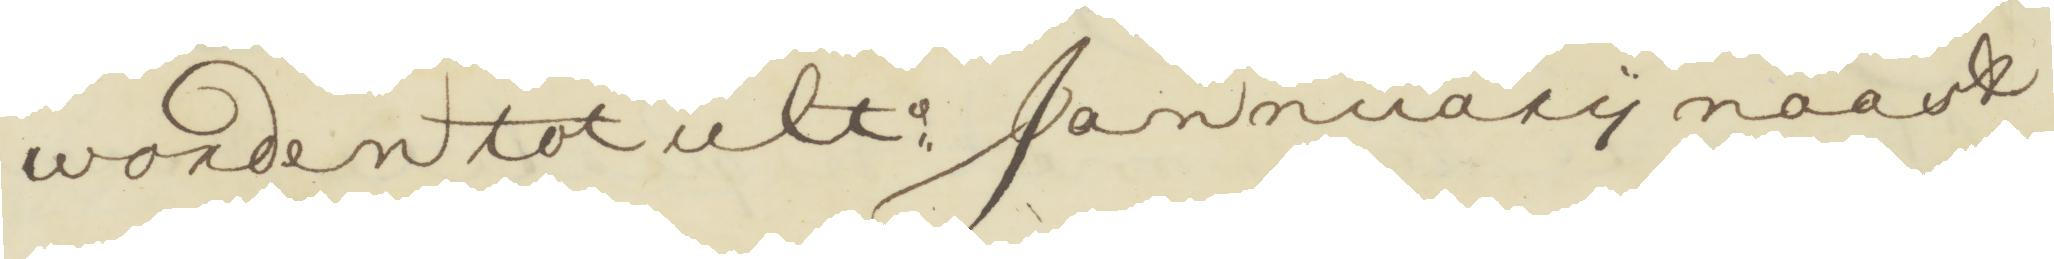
worden tot ult:o Jannuarij naast
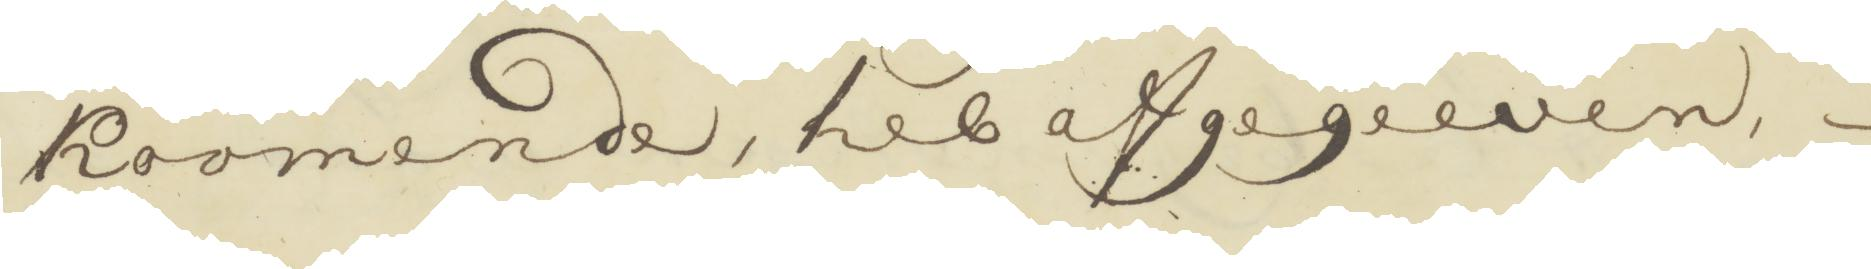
Koomende, heb afgegeeven,
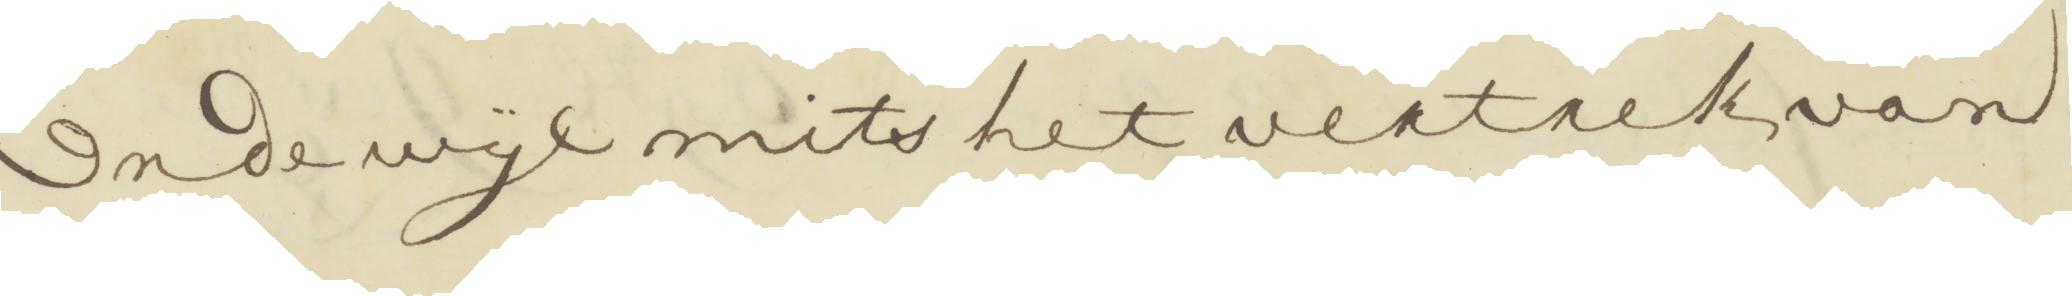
Ende wijl mits het vertrek van
